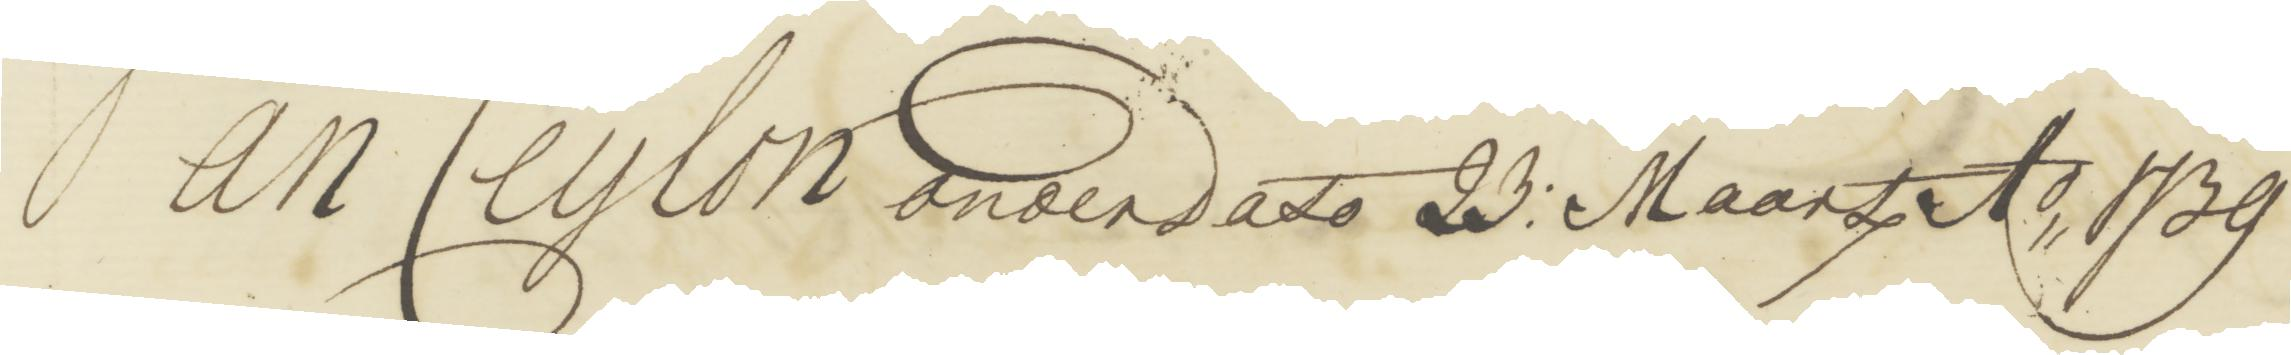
Van Ceijlon onder dato 23: Maart A„o 1739
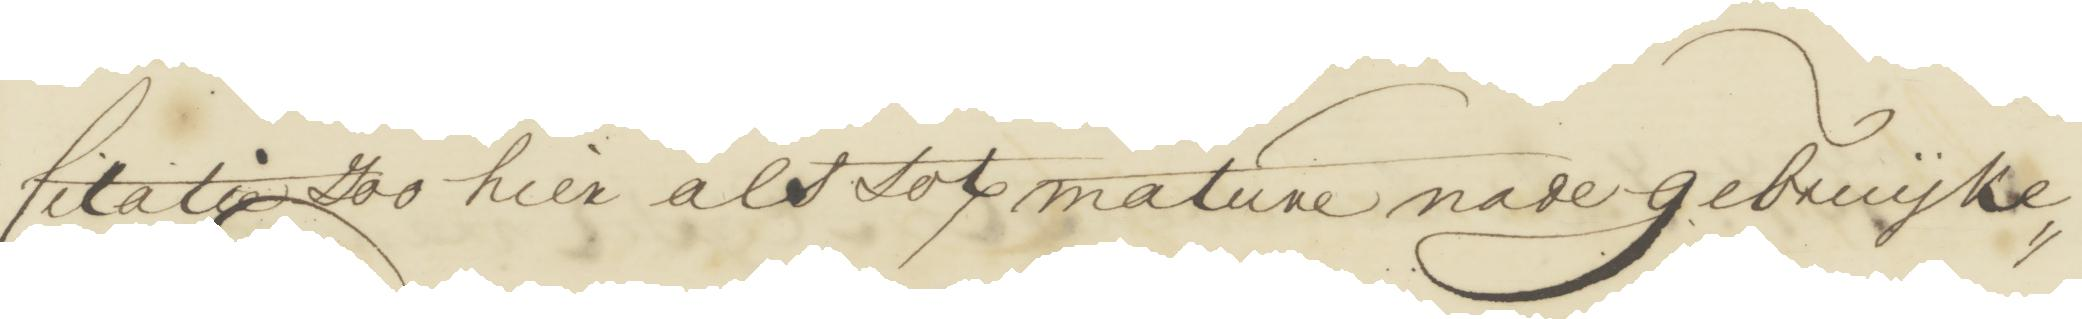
Citatie zoo hier als tot mature nade gebruijke„
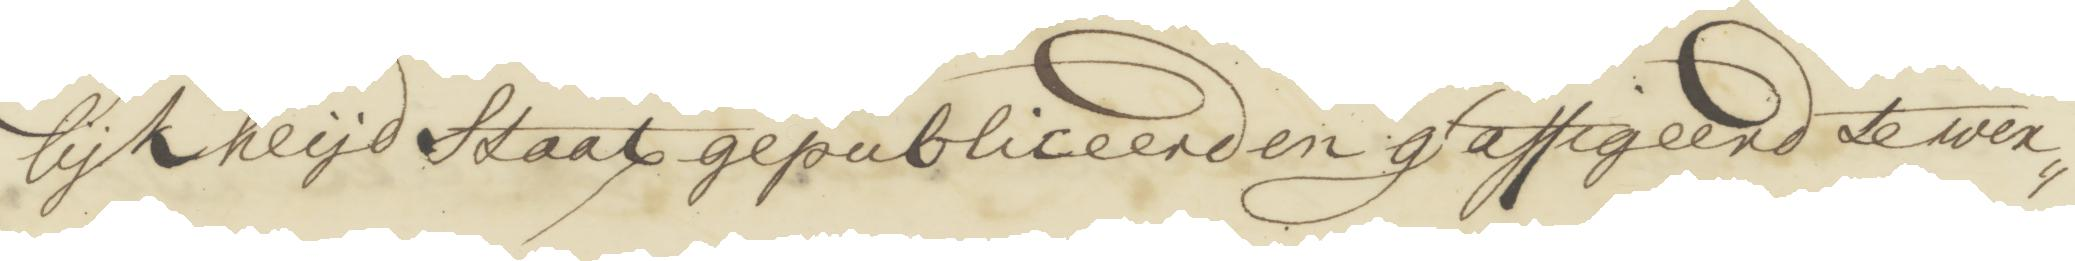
lijk heijd staat gepubliceerden g’affigeerd te wer„
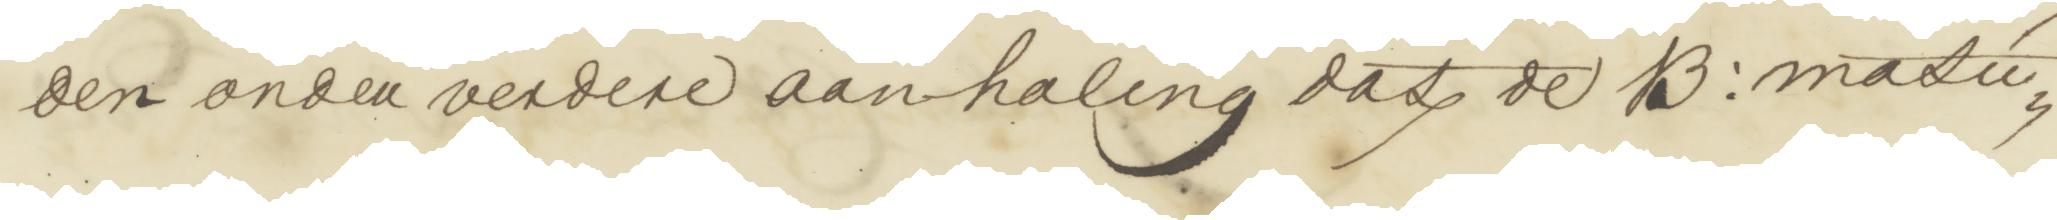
den onder verdere aanhaling dat de B: matu„
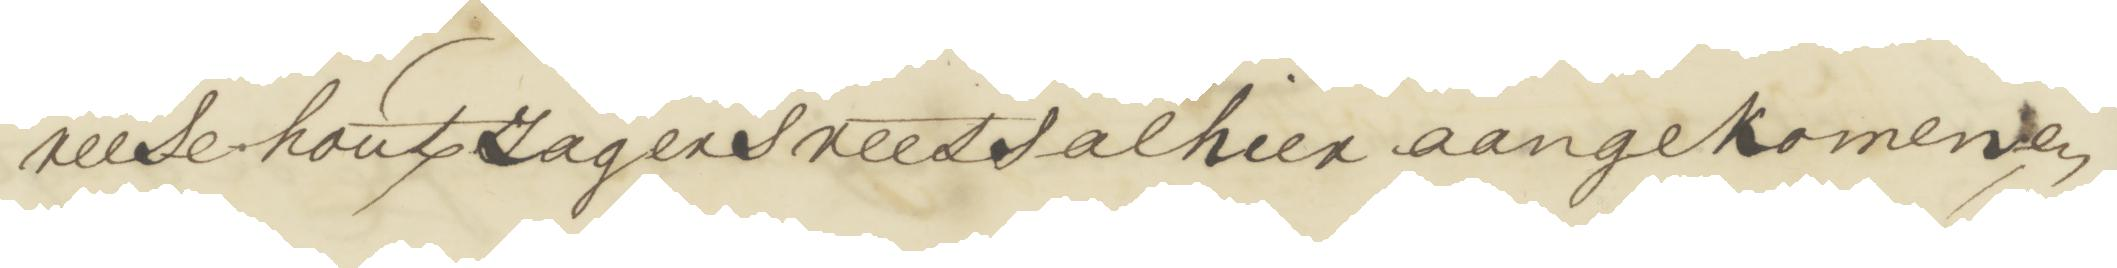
reese hout zagers reets alhier aangekomen en
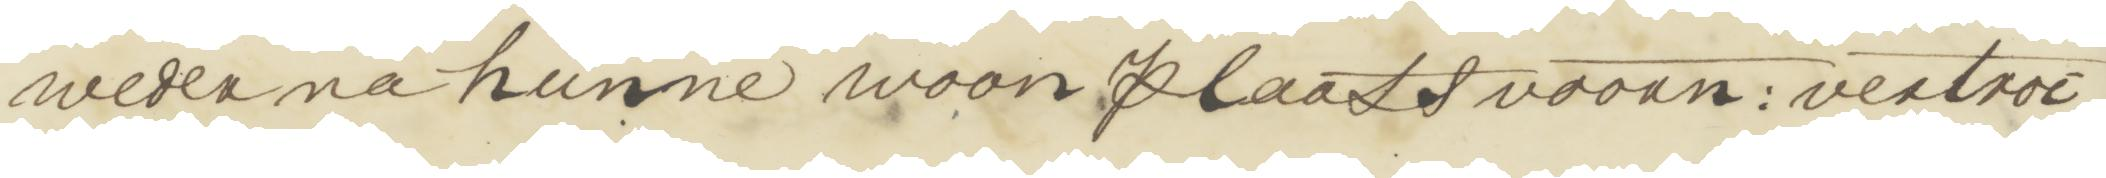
weder na hunne woon plaats voorn: vertroc
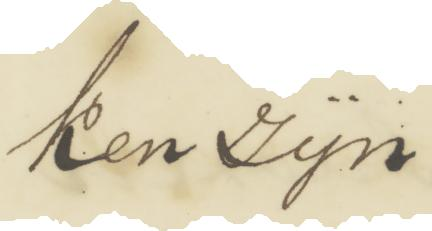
ken zijn
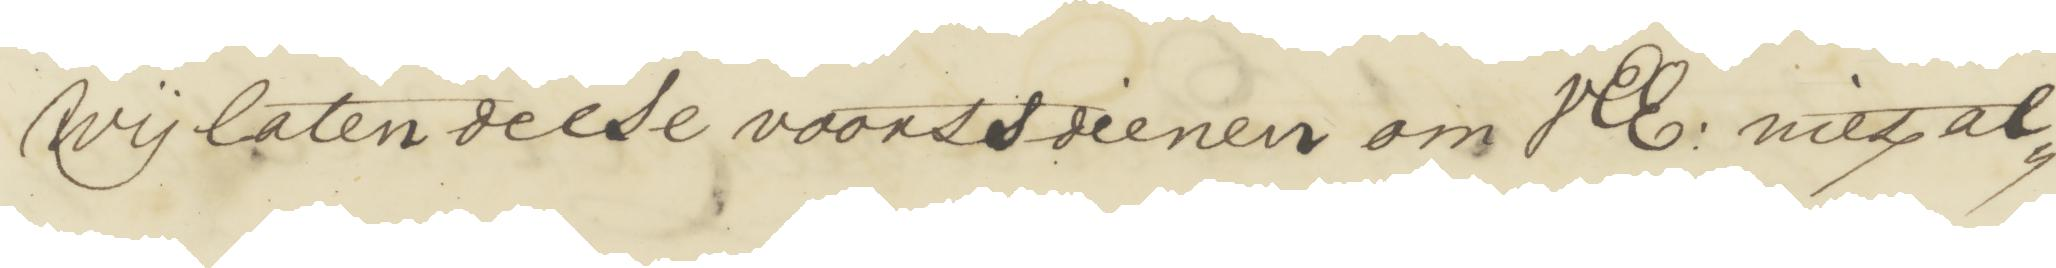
wij laten deese voorts dienen om VEE: niet al„
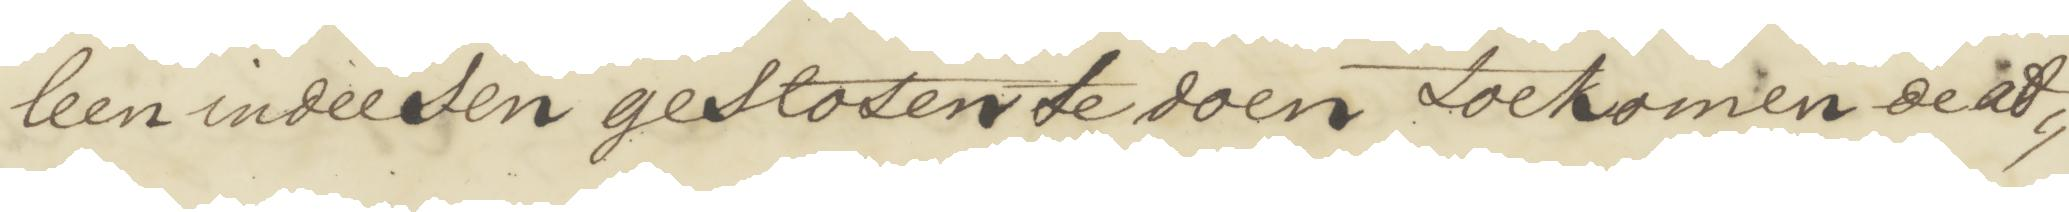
leen in deesen gesloten te doen toekomen de af„
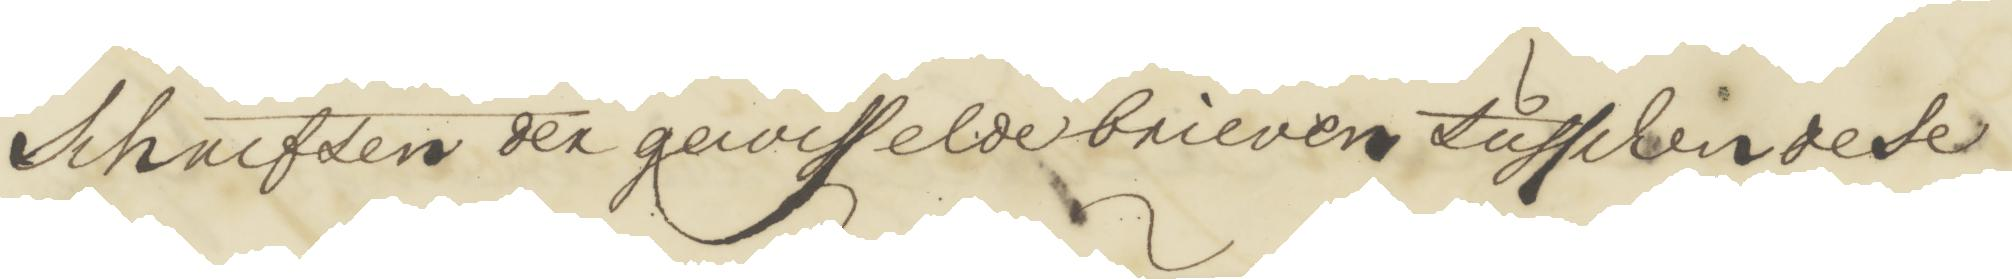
schriften der gewisselde brieven tusschen dese
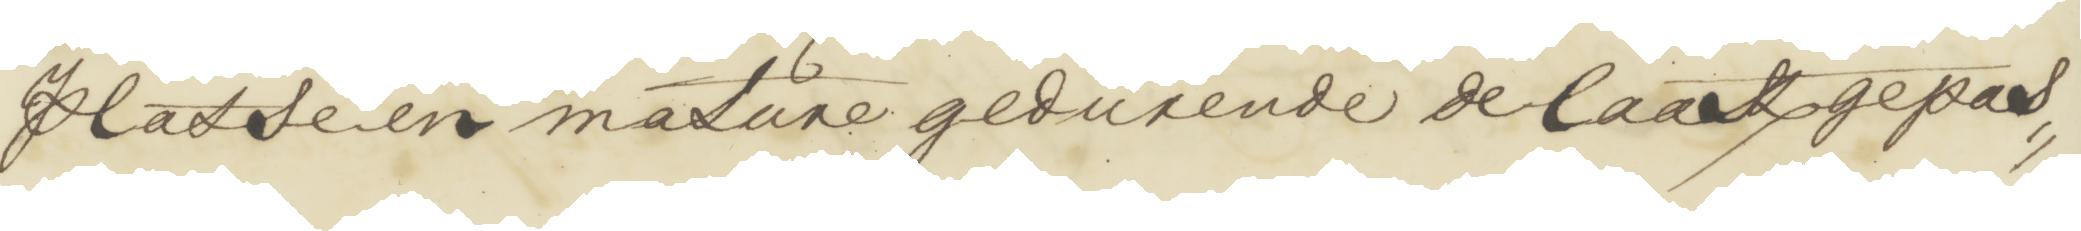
Platse en mature gedurende de laast gepas„
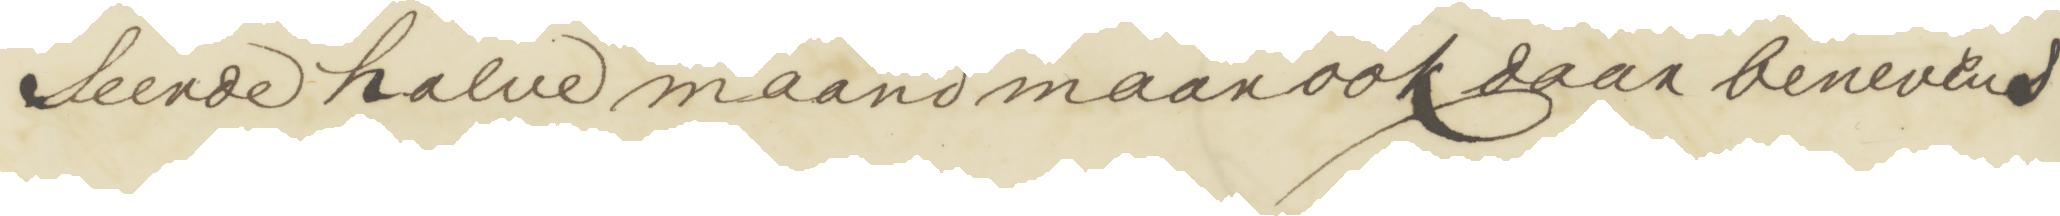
seerde halve maand maar ook daar benevens
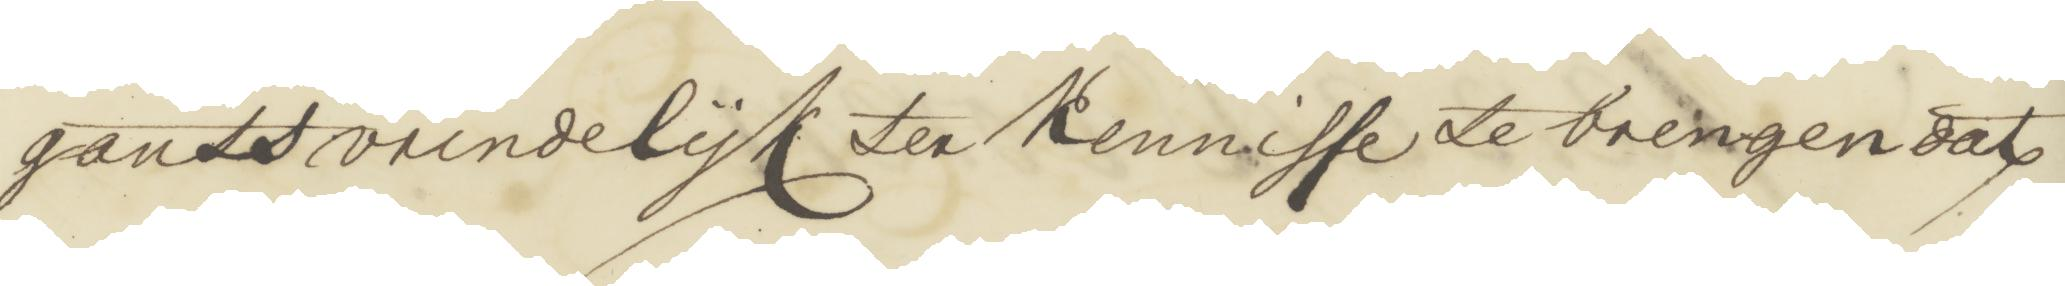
gants vrindelijk ter kennisse te brengen dat
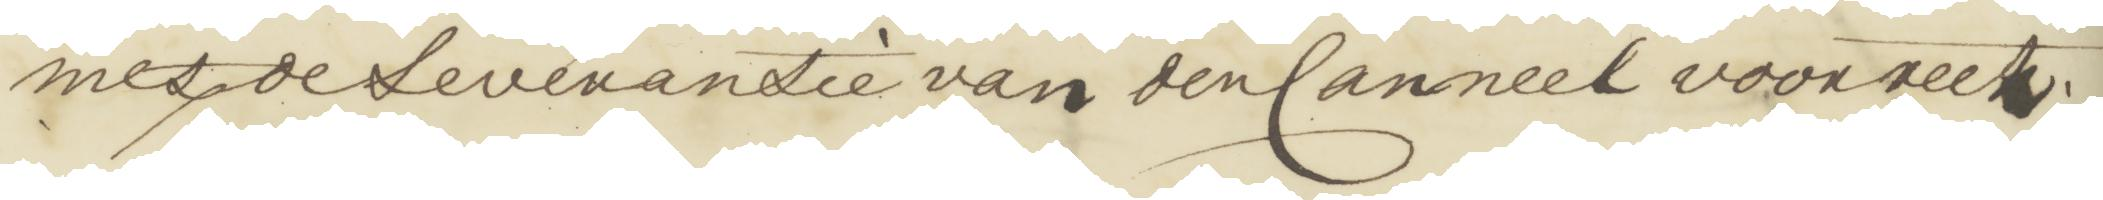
met de Leverantie van den Canneel voor reek:
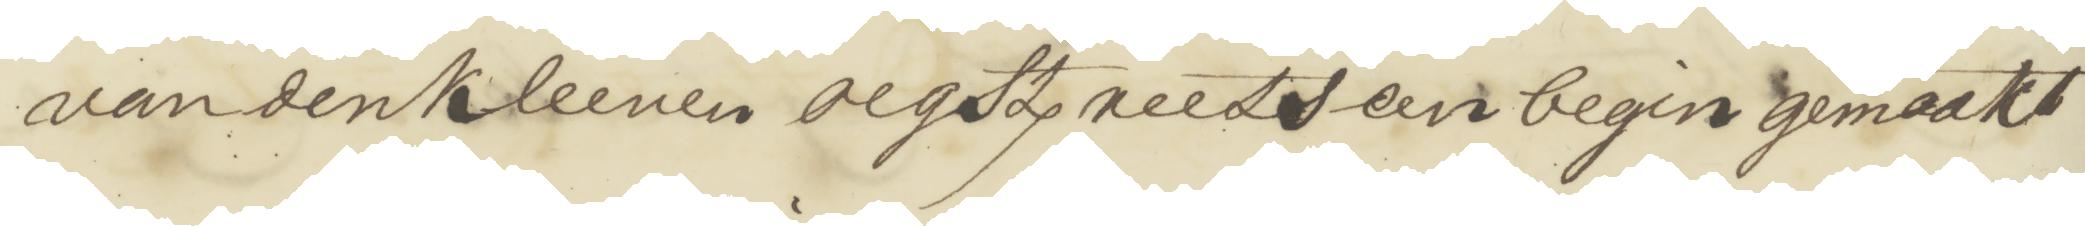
van den kleenen oegst reets een begin gemaakt
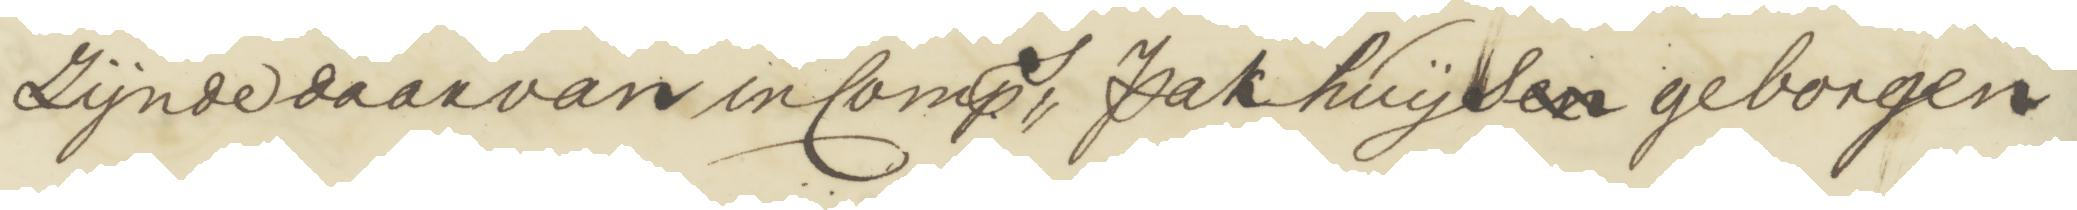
zijnde daarvan in Comp„s Pakhuijsen geborgen
